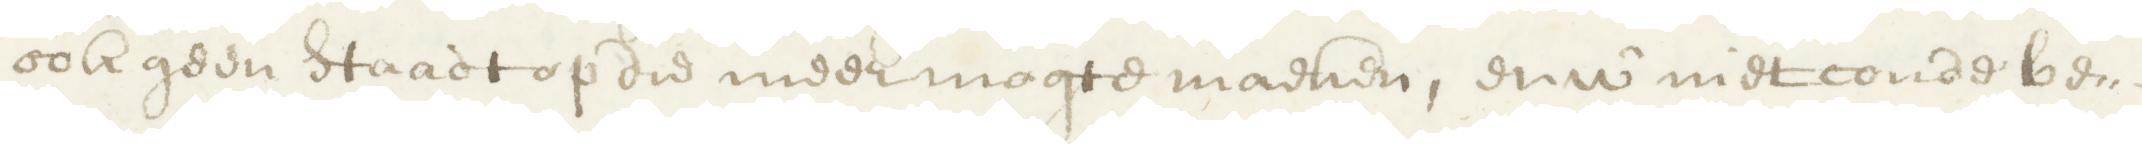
ook geen staadt op die meer mogte maeken, en w' niet conde be„
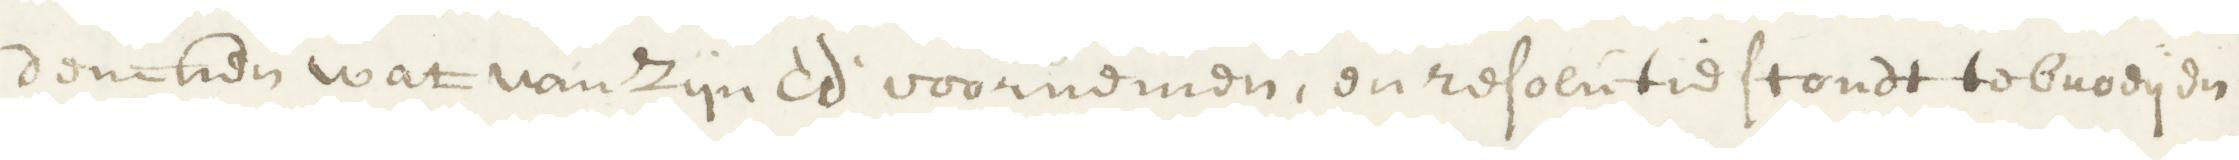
dencken wat van zijn Ed voornemen, en resolutie stondt te broeijen
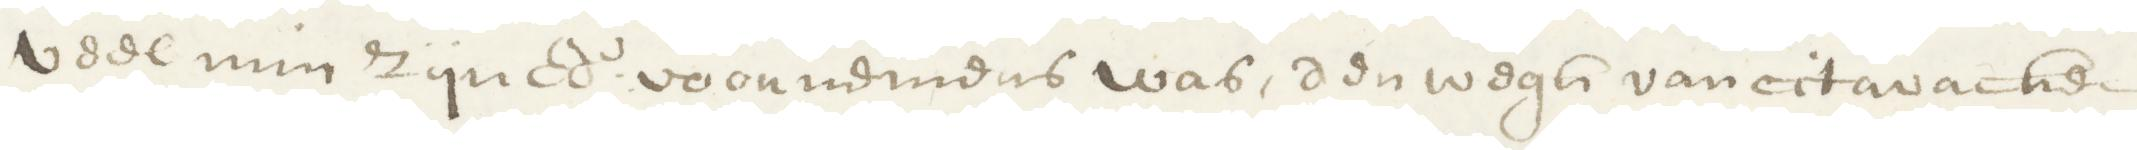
veel min zijn Ed:e voornemens was, den wegh van citavacke
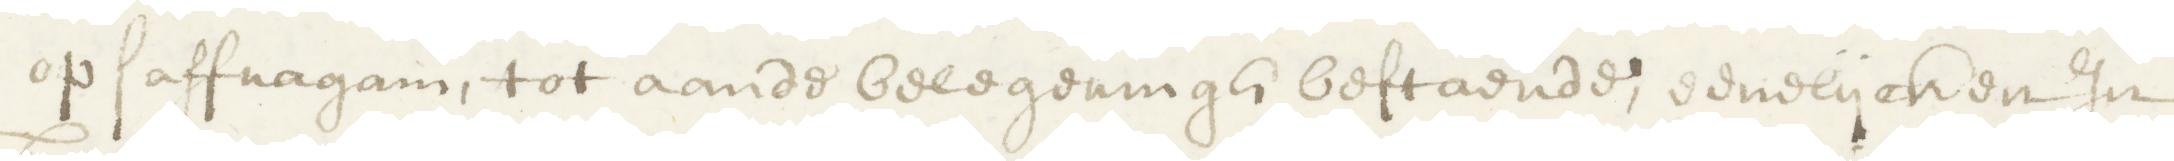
op saffragam, tot aan de belegeringh bestaende, eenelijcken Jn
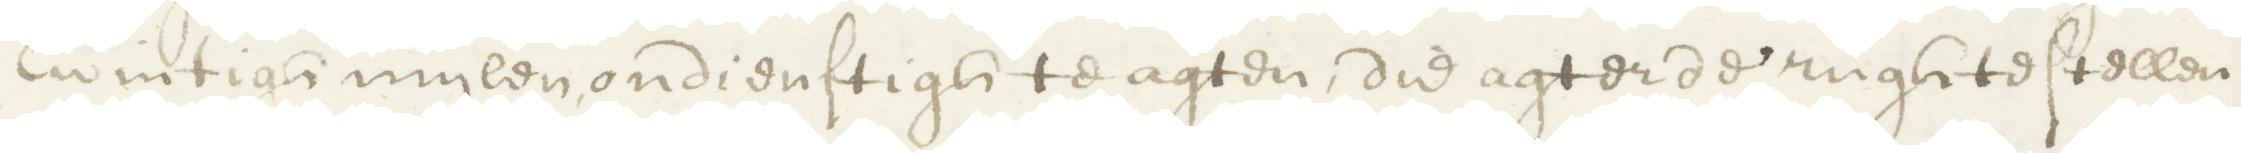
Twintigh mijlen ondienstigh te agten, die agter de rugh te stellen
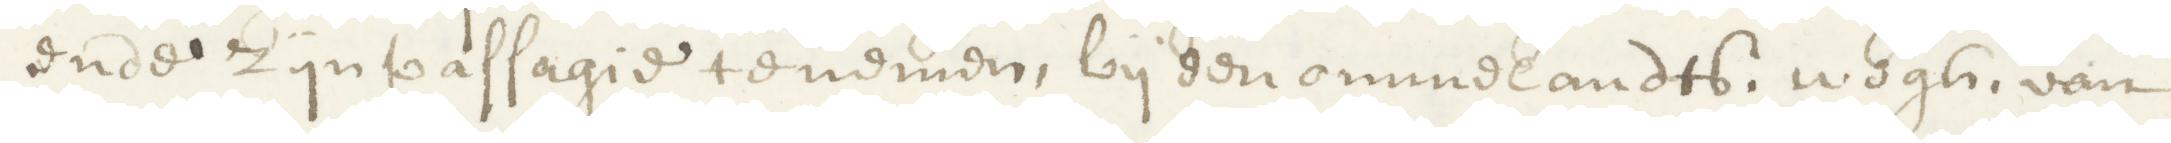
ende zijn passagie tenemen, bij een ommelandts. wegh. van
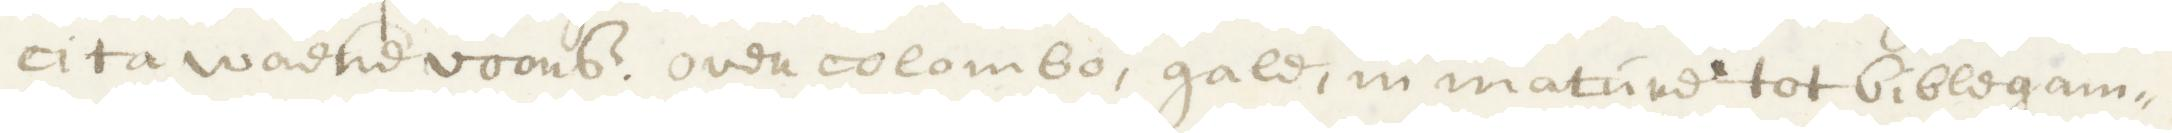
citawaeke voors. over colombo, gale, in mature tot biblegam„
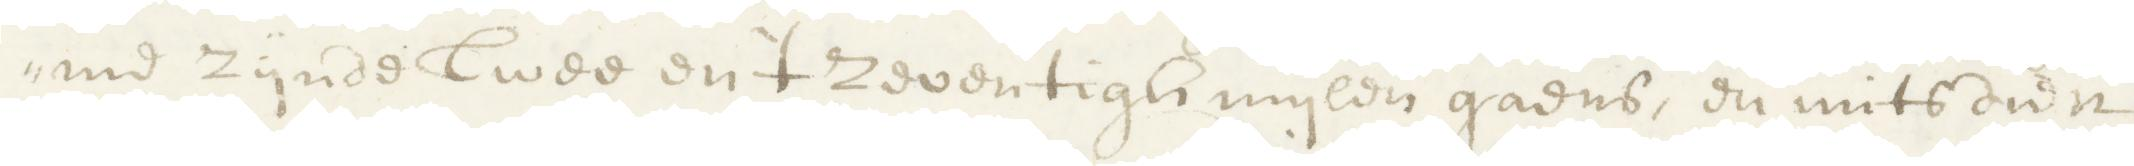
„me zijnde Twee en ’t zeventigh mijlen gaens, en mits dien
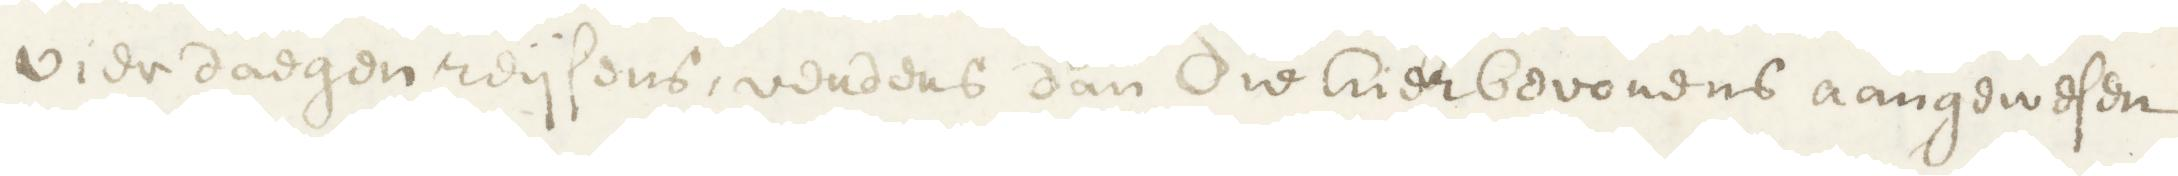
vier daegen reijsens, verders dan die hier bevorens aangewesen
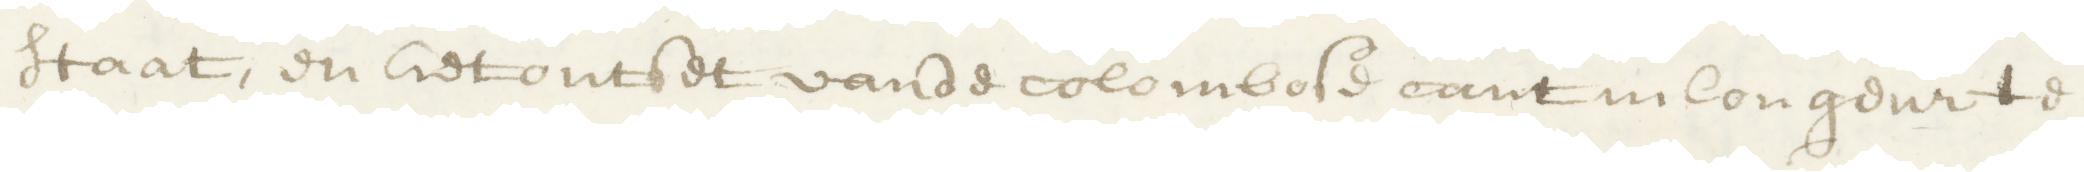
staat, en het ontset vande colombose cant in longeur te
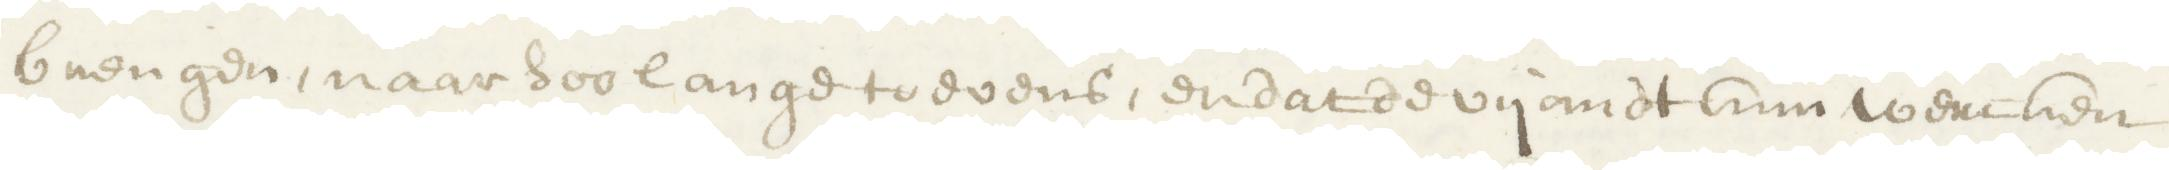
brengen, naar soo lange toevens, en dat de vijandt hun wercken
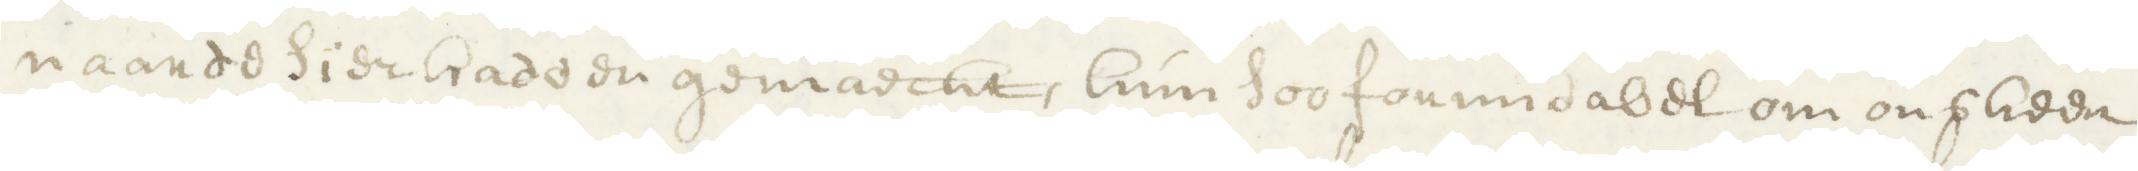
naar de sier hadden gemaeckt, hun soo formidabel om ons heen
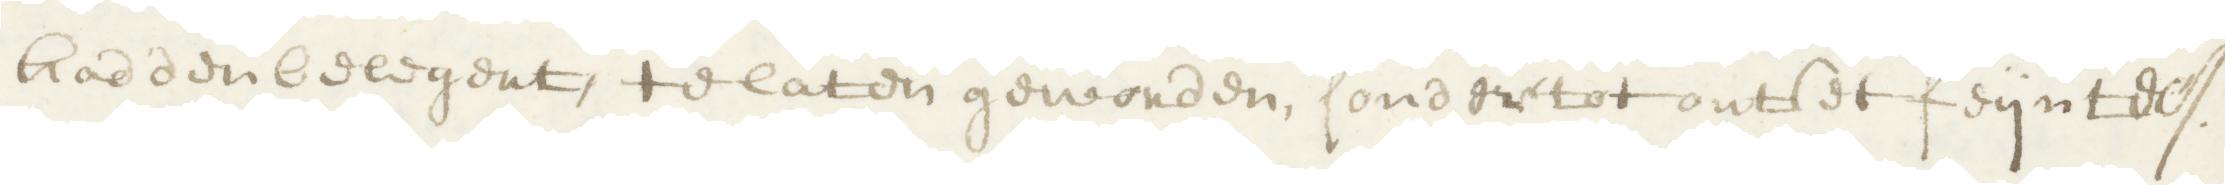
hadden belegert, te laten geworden, sonder tot ontset feijntelijk
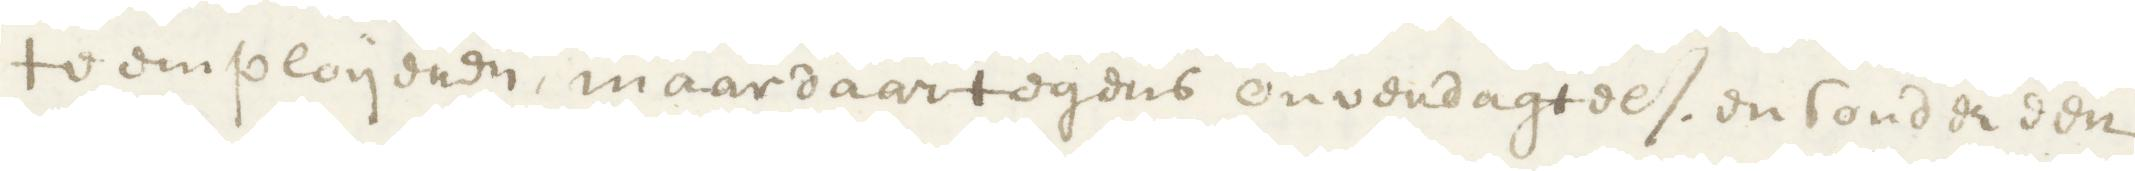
te emploijeren, maar daar tegens onverdagtelijk en sonder een
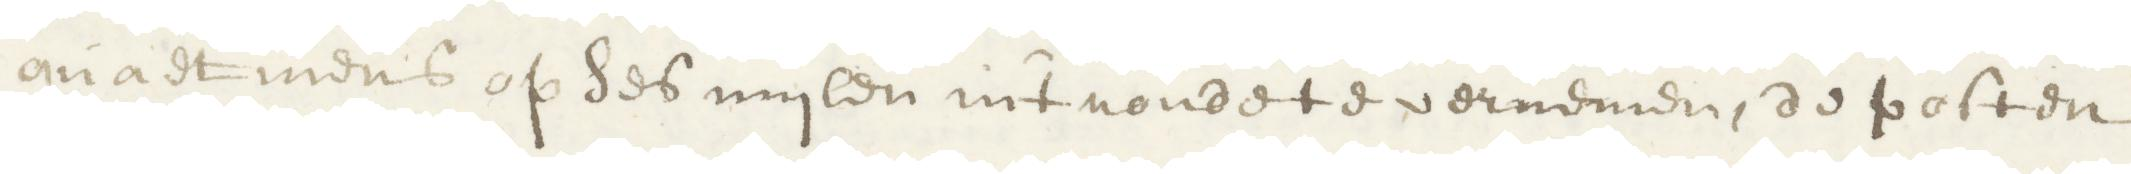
quaet mens op ses mijlen in’t ronde te vernemen, de posten
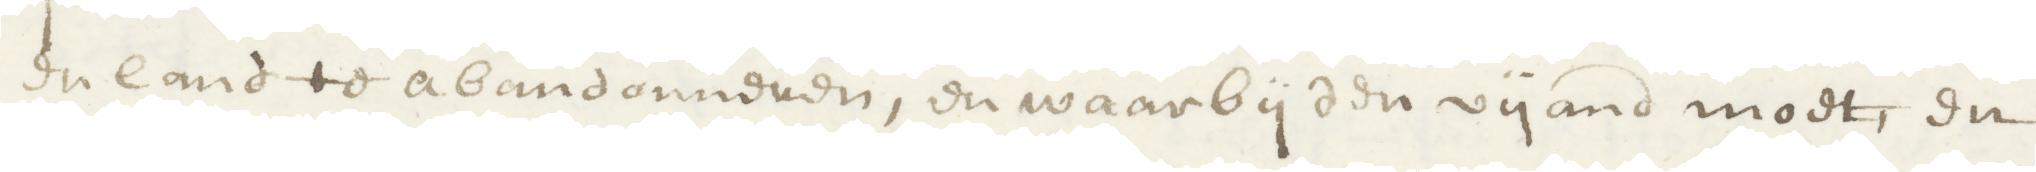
en land te abandonneren, en waar bij den vijand moet, en
